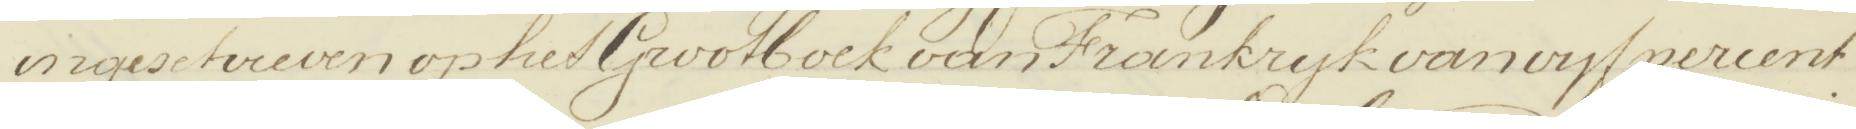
ingeschreven op het Grootboek van Frankryk van vyf percent
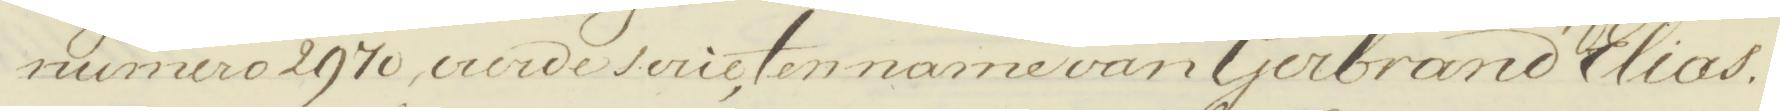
numero 2970, vierde serie, ten name van Gerbrand Elias.
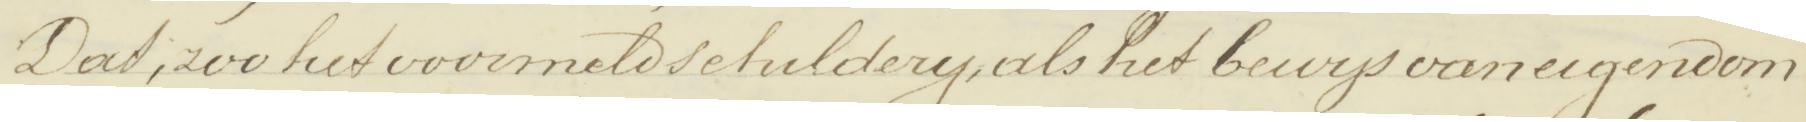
Dat, zoo het voormeld schildery, als het bewys van eigendom
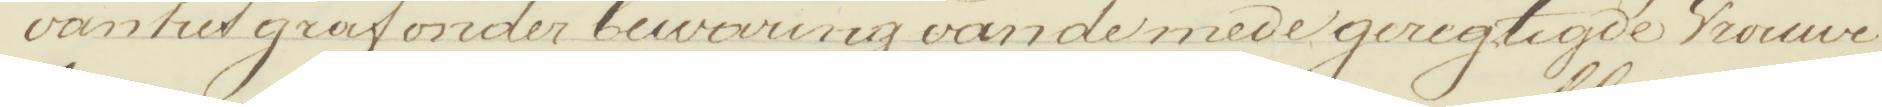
van het graf onder bewaring van de mede geregtigde Vrouwe
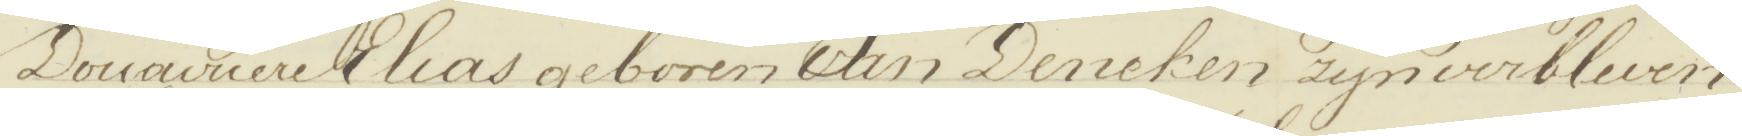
Douairiere Elias geboren van Deneken zyn verbleven.
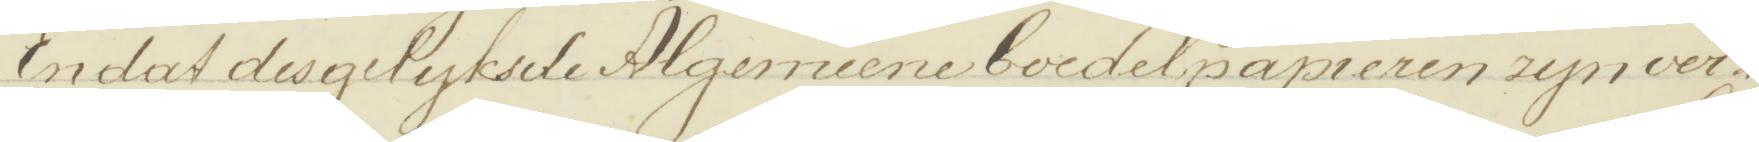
En dat des gelyks de Algemeene boedel papieren zyn ver„
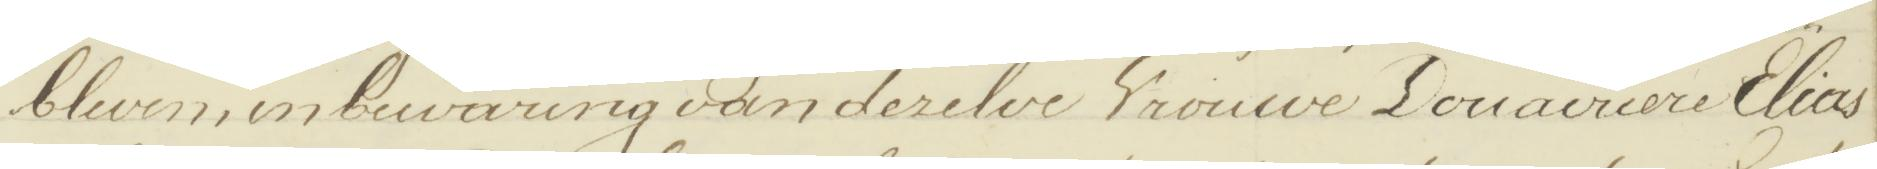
bleven, in bewaring van dezelve Vrouwe Douairiere Elias
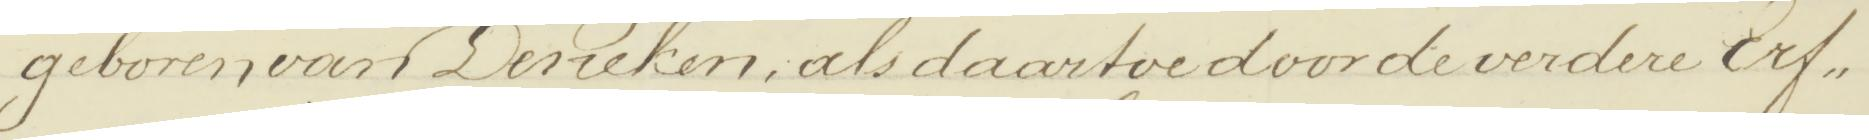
geboren van Deneken, als daartoe door de verdere Erf„
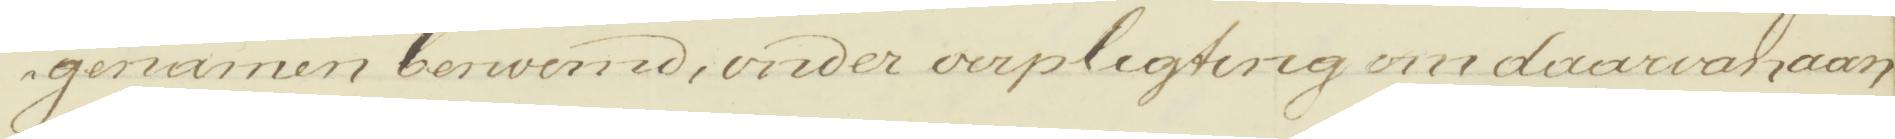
„genamen benoemd, onder verpligting om daarvan aan
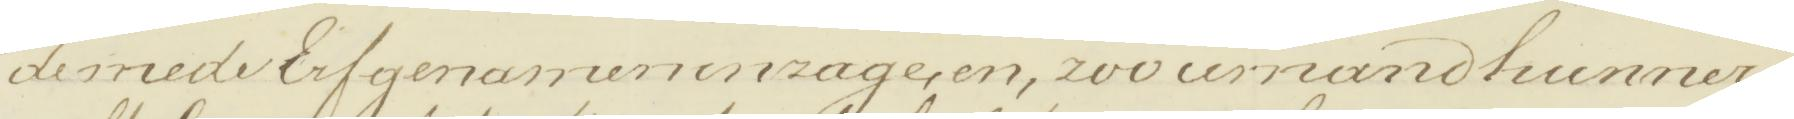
de mede Erfgenamen inzage, en, zoo iemand hunner
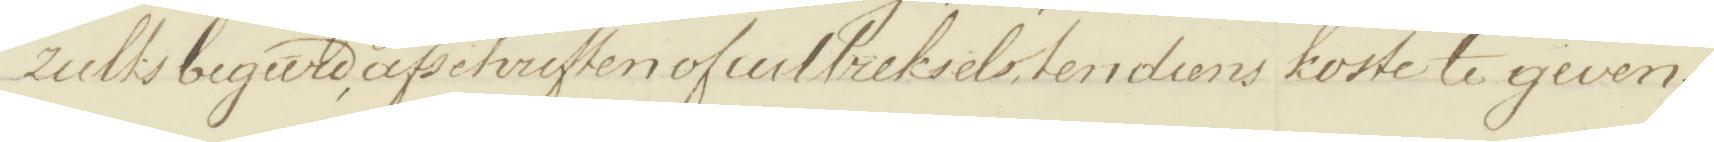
zulks begeerd, afschriften of uittreksels, ten diens koste te geven.
